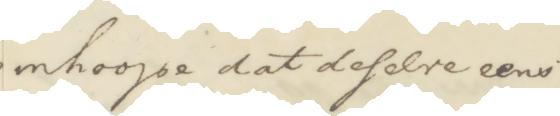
inhoope dat deselve eens
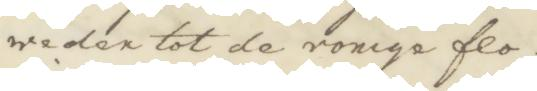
weder tot de vorige flo„
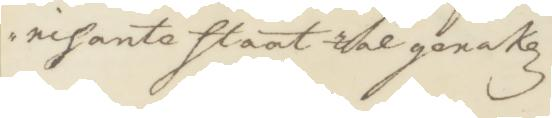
„risante staat zal geraken
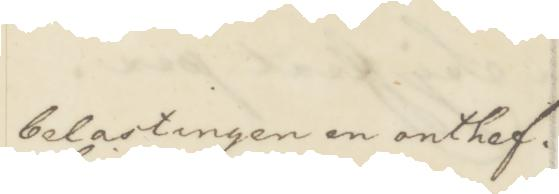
belastingen en onthef„
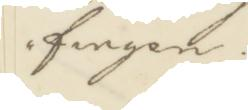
„fingen.
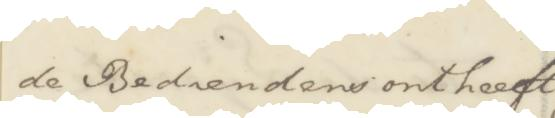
de Bediendens ontheeft
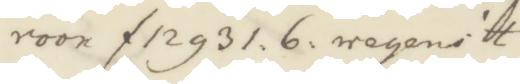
voor ƒ 12931:6: wegens 't
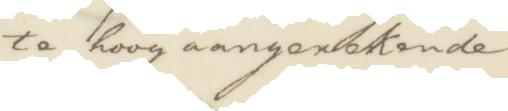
te hoog aangerekende
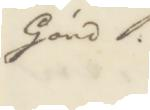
goud.
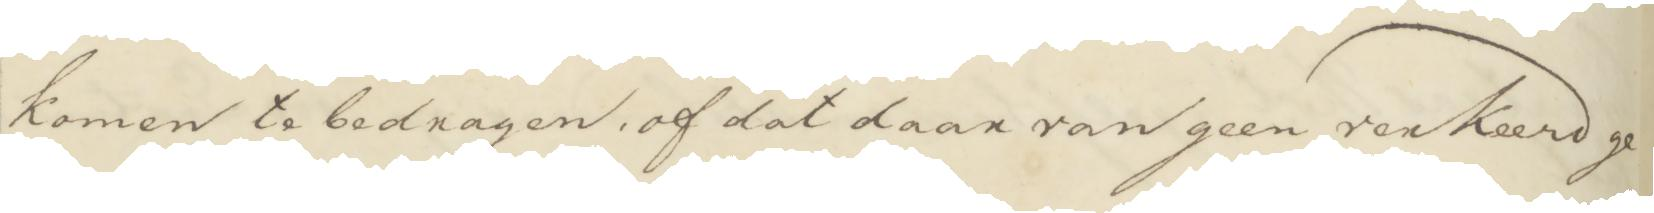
komen te bedragen, of dat daar van geen verkeerd ge
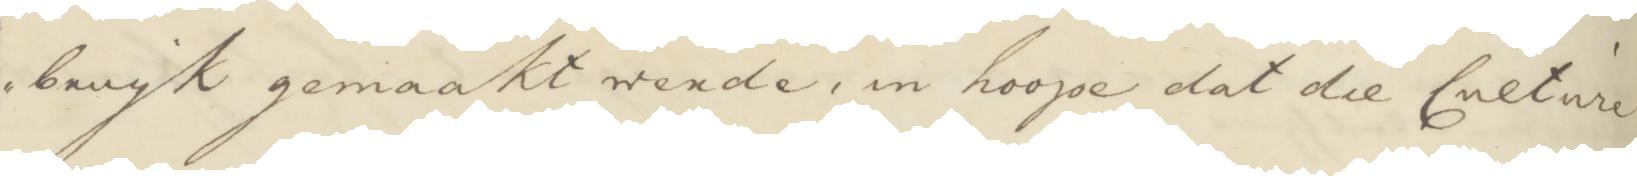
„bruijk gemaakt werde, in hoope dat die Culture
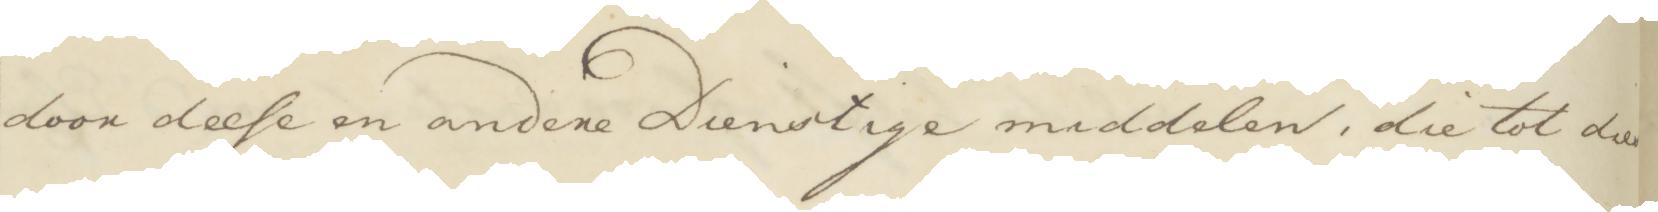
door deese en andere Dienstige middelen, die tot die
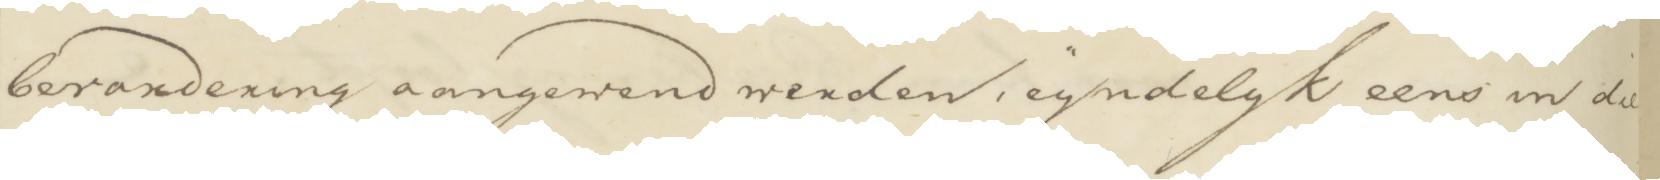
bevordering aangewend werden, eijndelijk eens in die
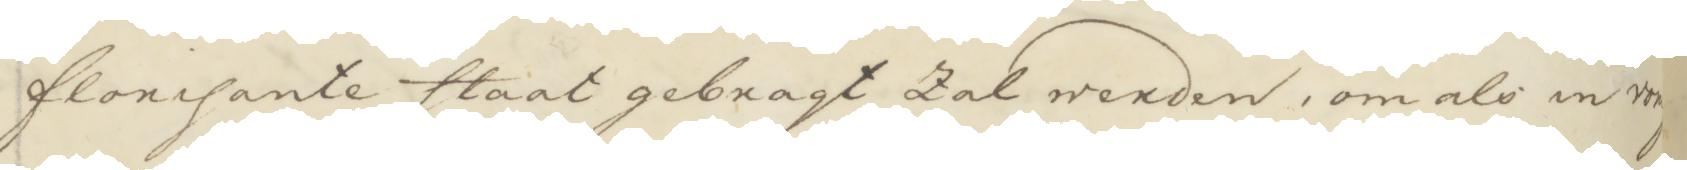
florisante staat gebragt zal werden, om als in v
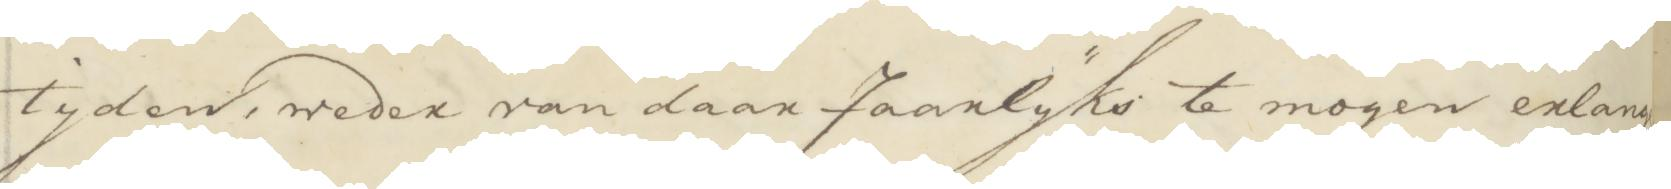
tijden, weder van daar Jaarlijks te mogen erlang
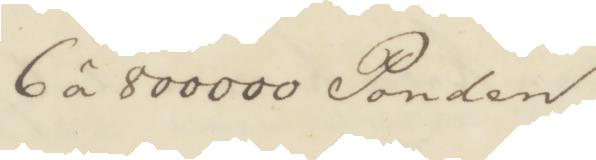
6 à 800'000 Ponden.
